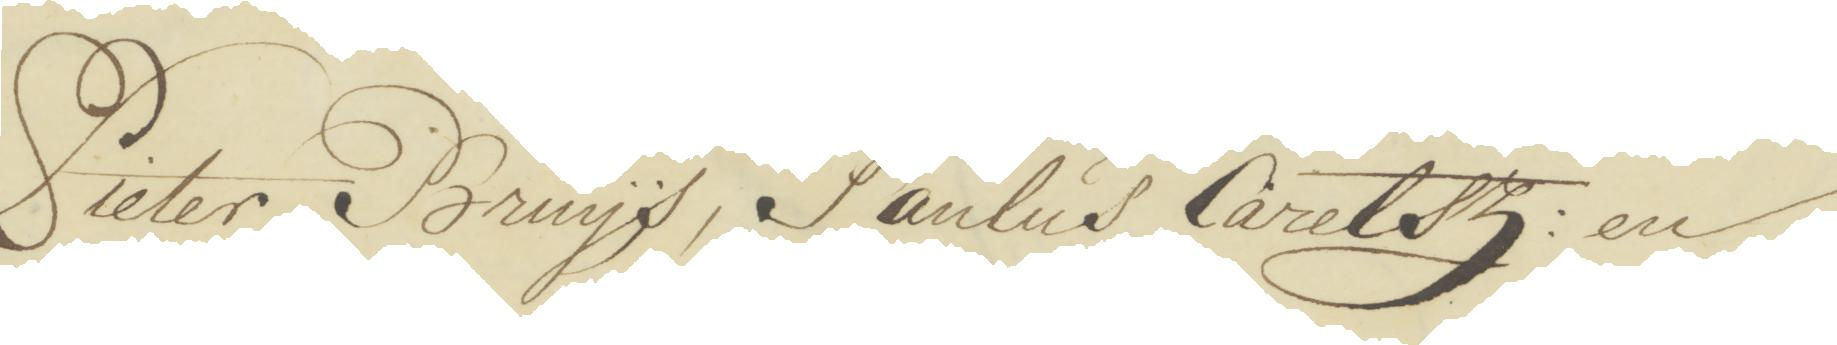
Pieter Bruijs, Paulus Carelsz: en
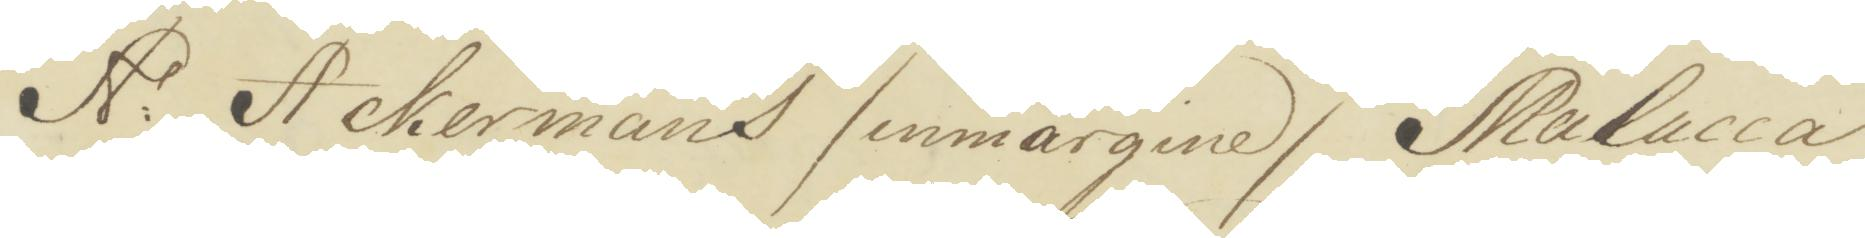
A:o Ackermans /in margine/ Malacca
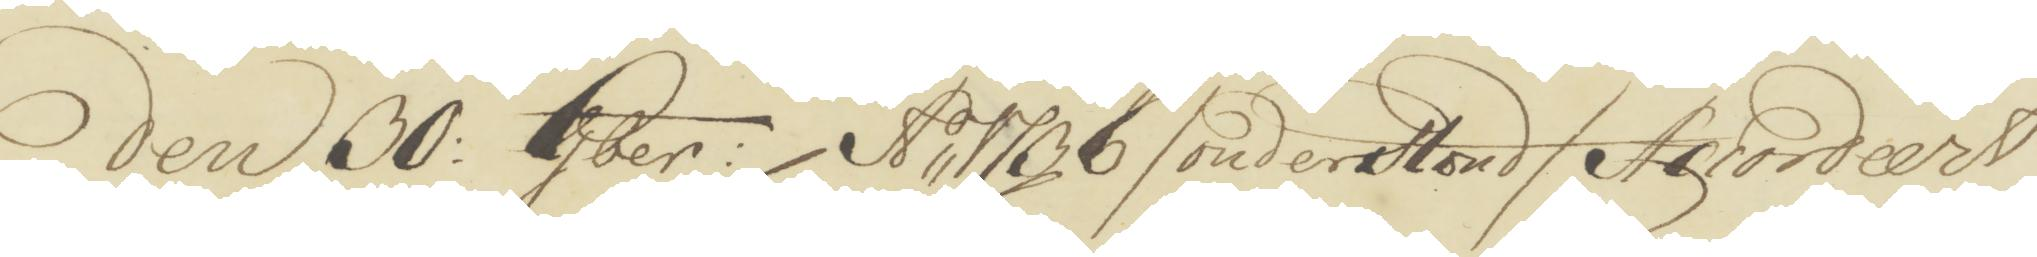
den 30: 9ber: A„o 1736 /onderstond/ Accordeert
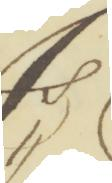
J„s
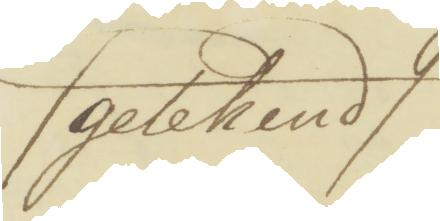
/getekend/
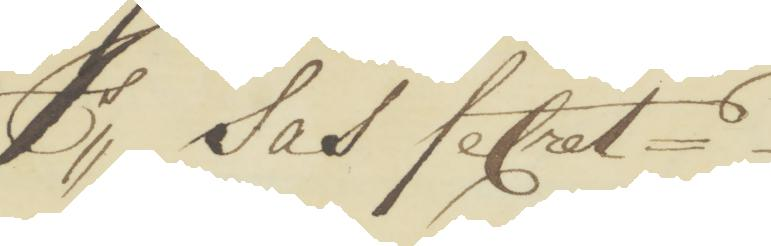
J„s sas secret=s
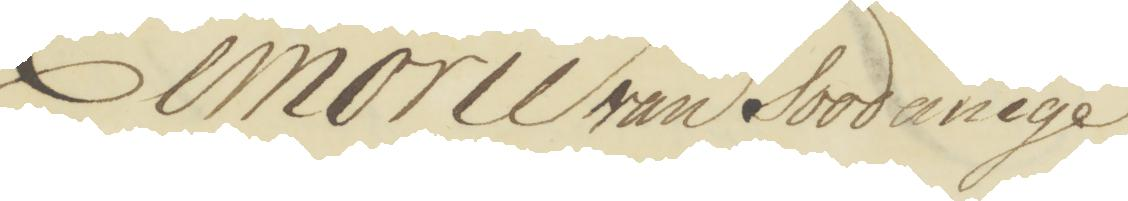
Memorie van soodanige
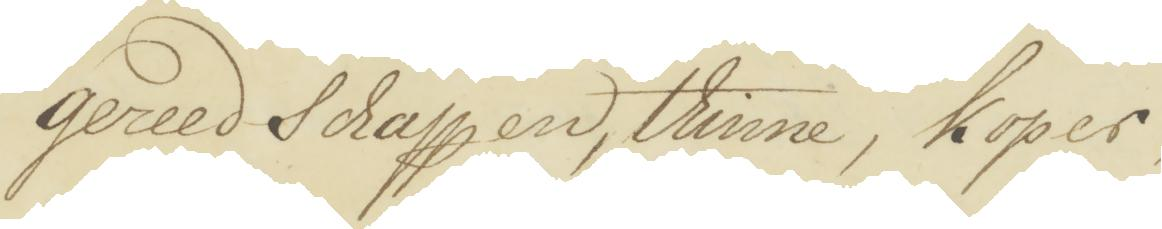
gereedschappen, tinne, koper,
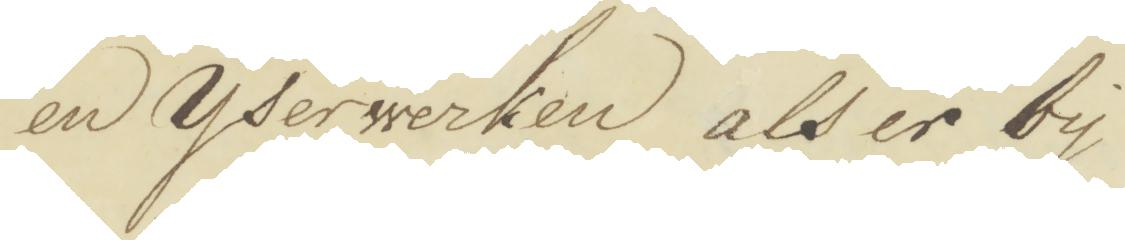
en ijserwerken als er bij
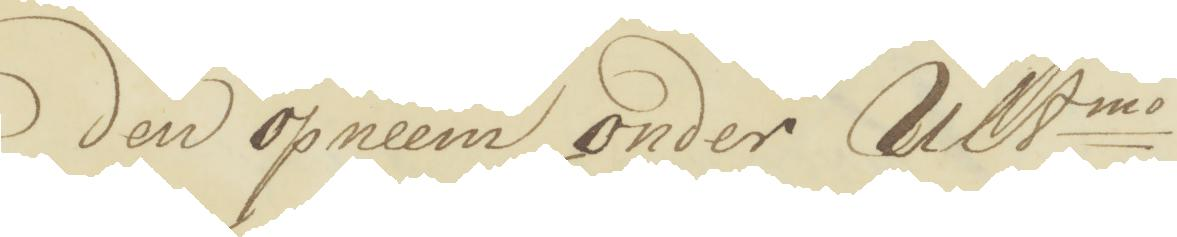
den opneem onder Ult=mo
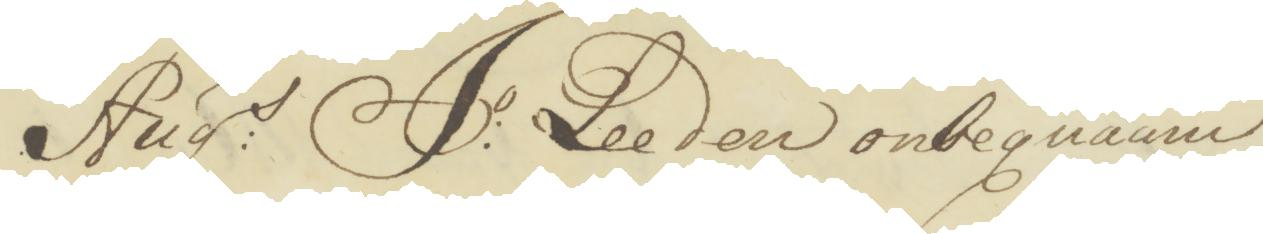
Aug:s J:o Leeden onbequaam
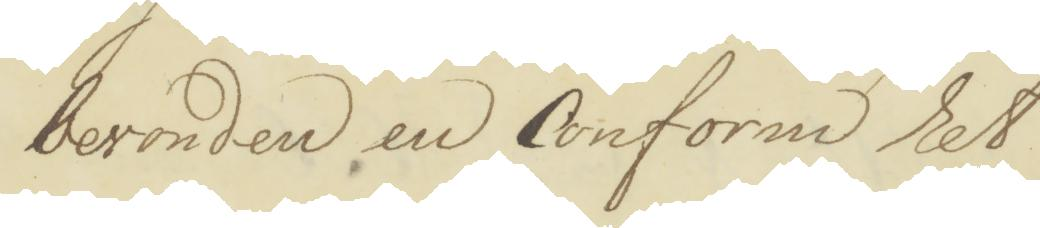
bevonden en conform het
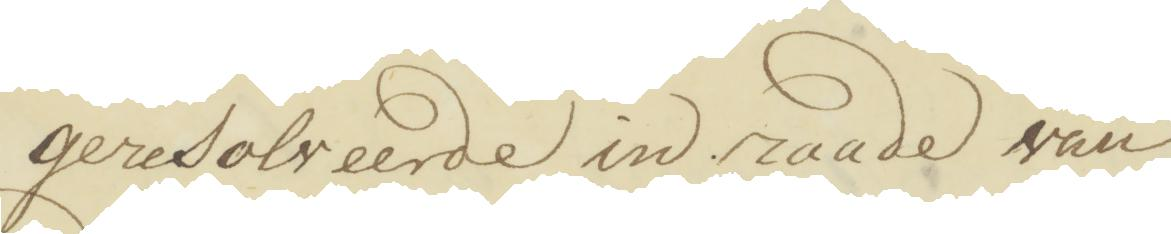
geresolveerde in raade van
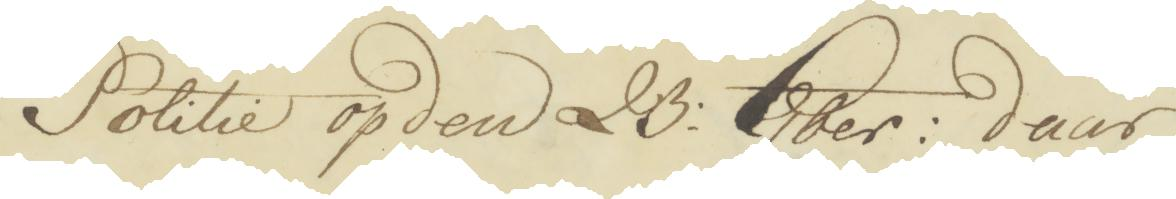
Politie op den 23: 9ber: daar
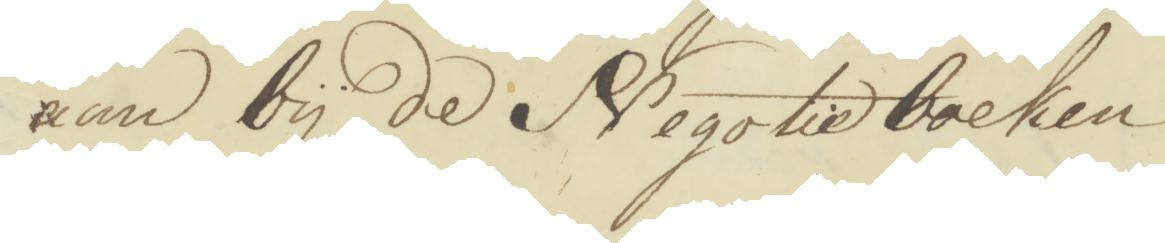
aan bij de Negotie boeken
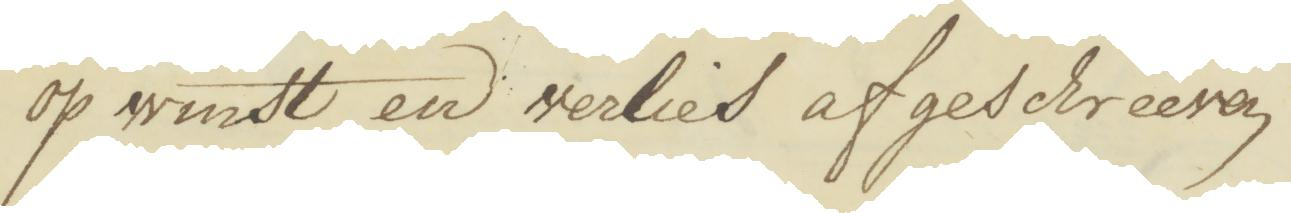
op winst en verlies afgeschreeven
